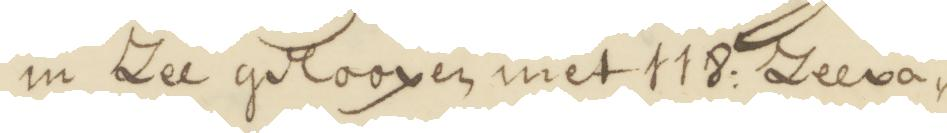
in zee geloopen met 118: zeeva„
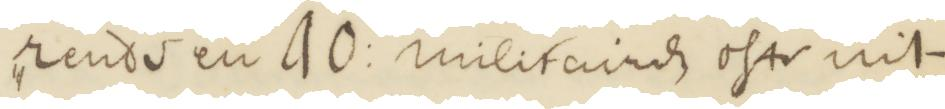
„rende en 40: militairen ofte in’t
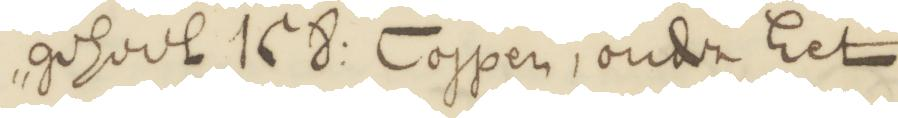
„geheel 158: coppen, onder het
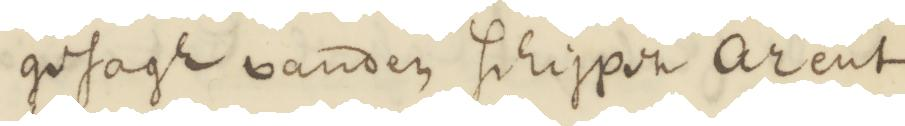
gesagh van den schipper Arent
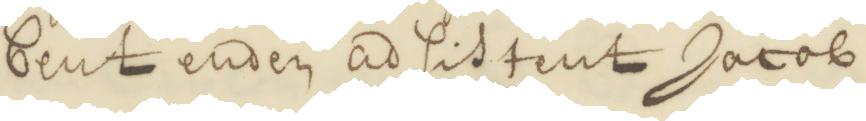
bent enden adsistent Jacob
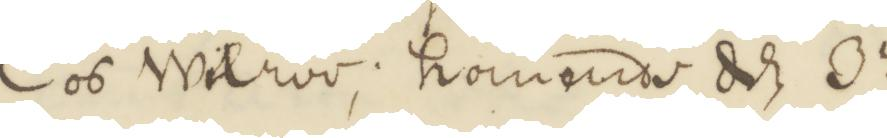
Cos Wilree; komende den 3:e
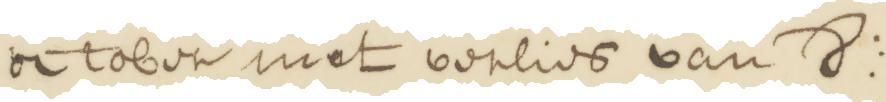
october met verlies van 8:
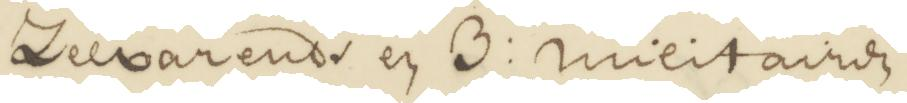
zeevarende en 3: militairen
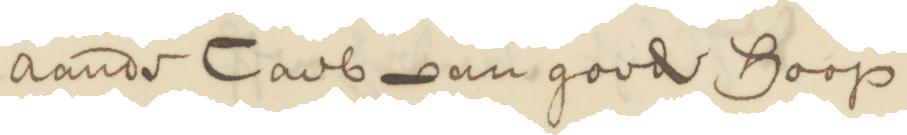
aande Caeb van goede Hoop
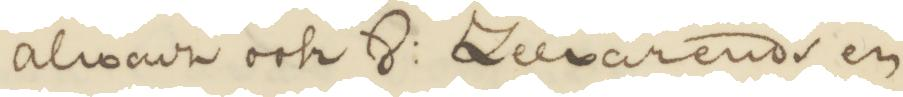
alwaer ook 8: zeevarende en
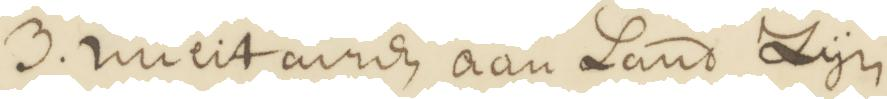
3. militairen aan land zijn
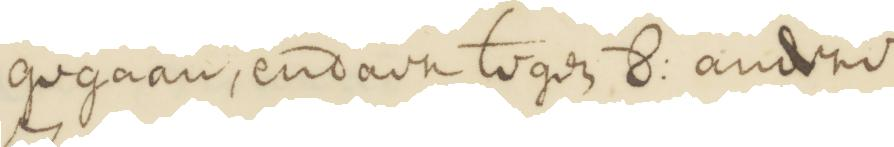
gegaan, en daer tegen 8: andere
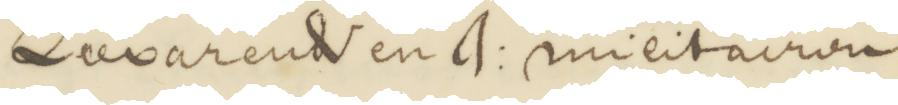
zeevarende en 4: militairen
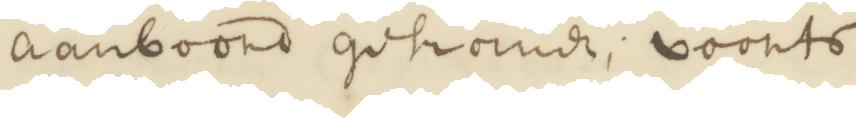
aanboord gekomen; voorts
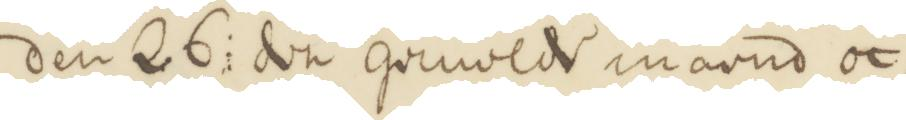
den 26: der gemelde maend oc„
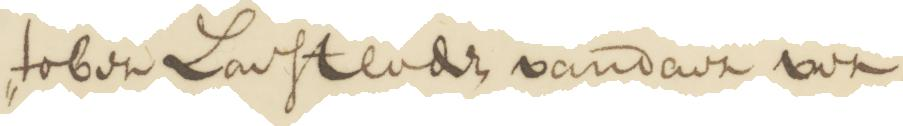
„tober Laestleden vandaer ver
